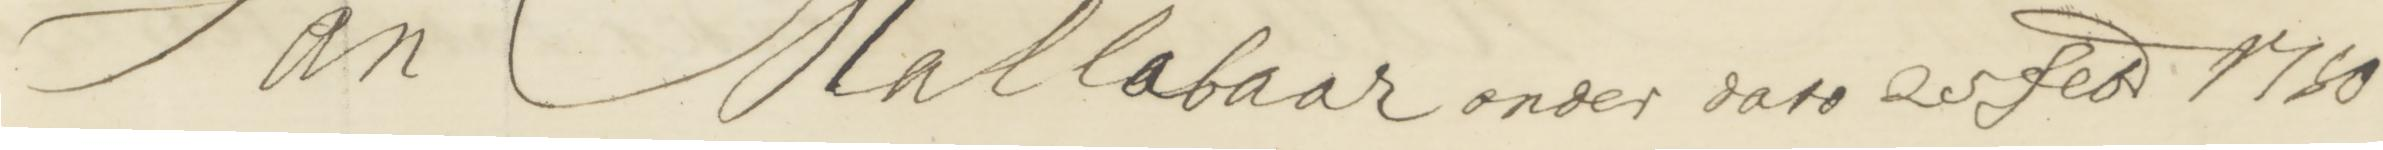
Van Mallabaar onder dato 25 feb 1750
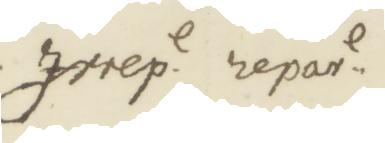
Jrrep.l repar„l
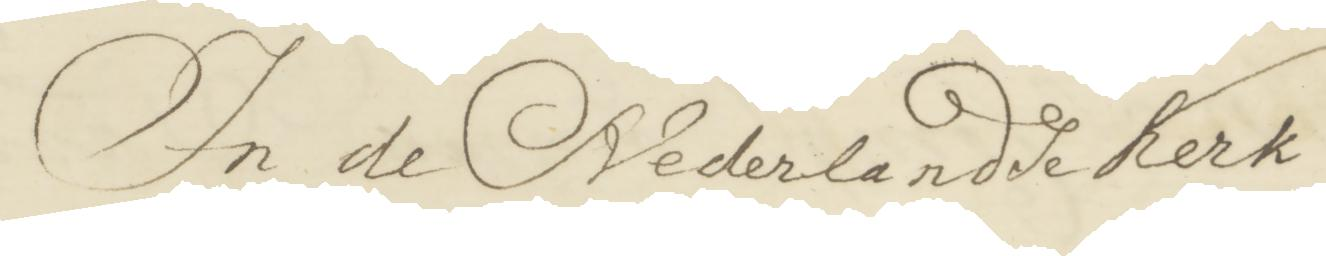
Jn de Nederlandse Kerk
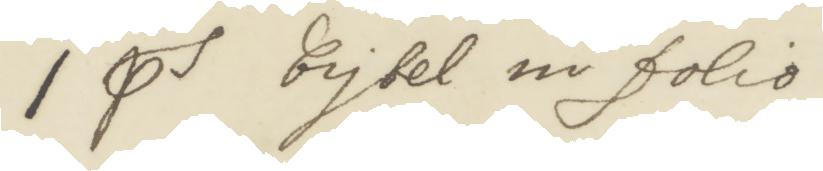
1 ps bijbel in folio
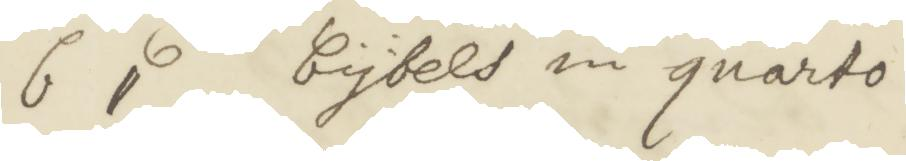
6 „s bijbels in quarto
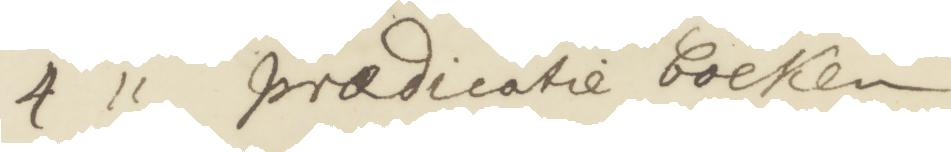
4 „ praedicatie boeken
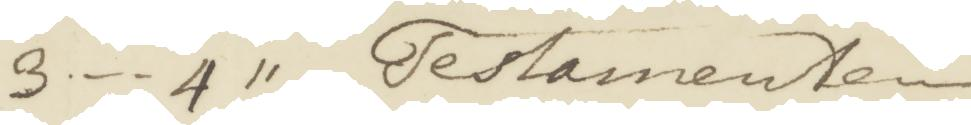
3. - - 4 „ Testamenten
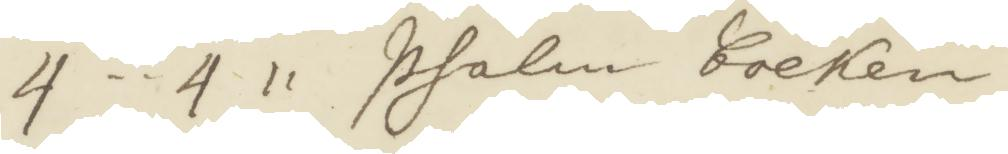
4 - - 4 „ psalm boeken
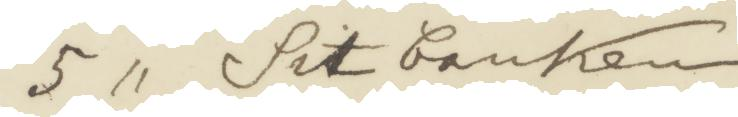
5 „ sitbanken
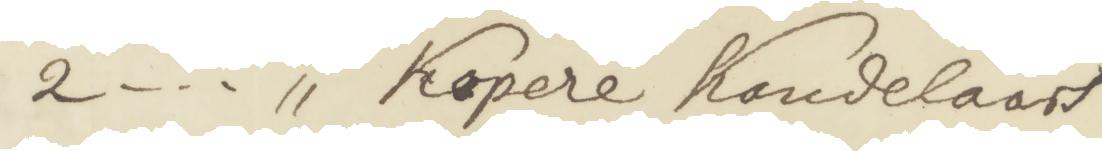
2 — - - „ Kopere Kandelaars
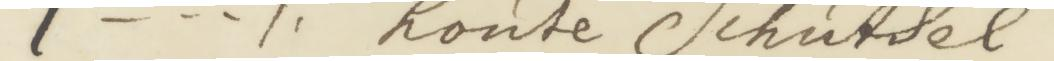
1 — - -. „ houte schutsel
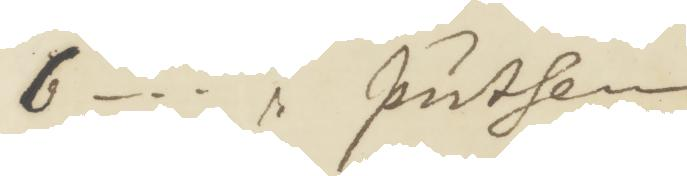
6 — - - „ putsen
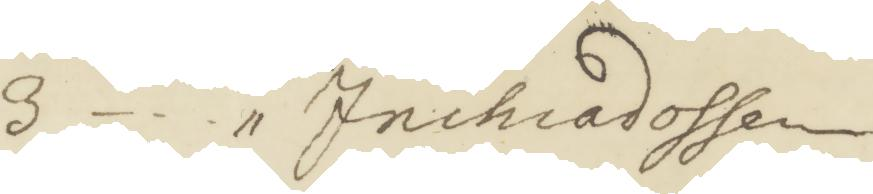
3 — - - „ Jchcadossen
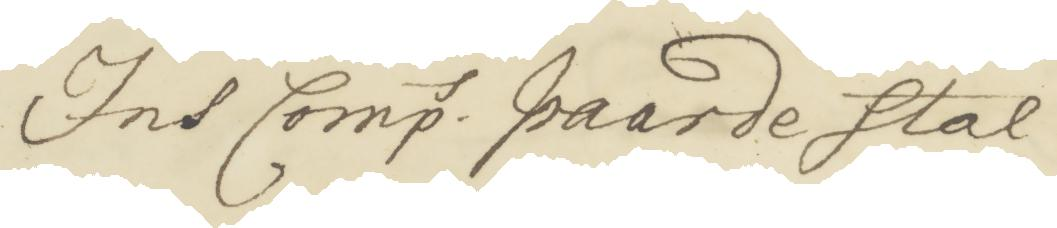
Ins Comp.s paarde stal
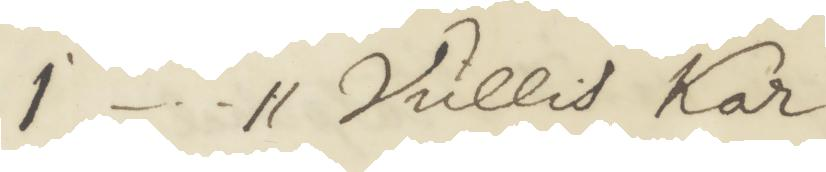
1 — - - „ Vullis kar
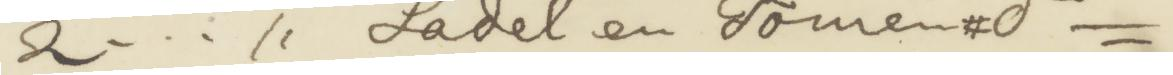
2 — - - „ sadel en Tomen tot # d=o
